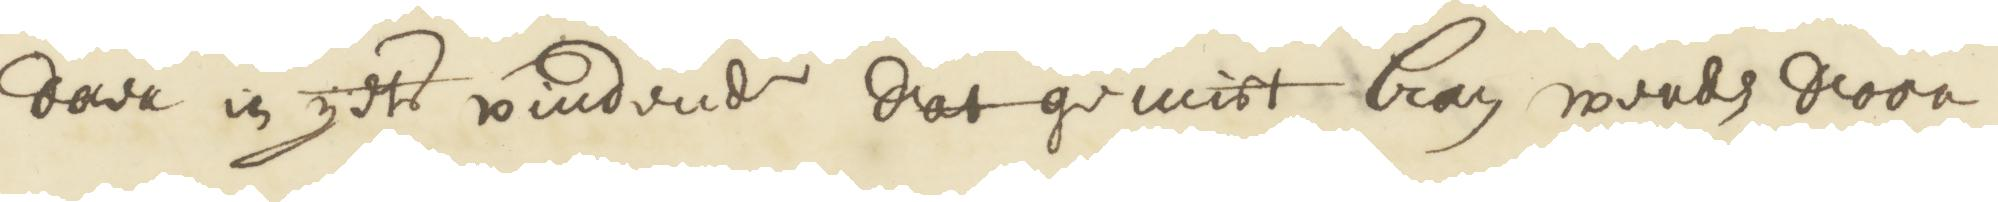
daer in ijets vindende dat gemist kan werden door
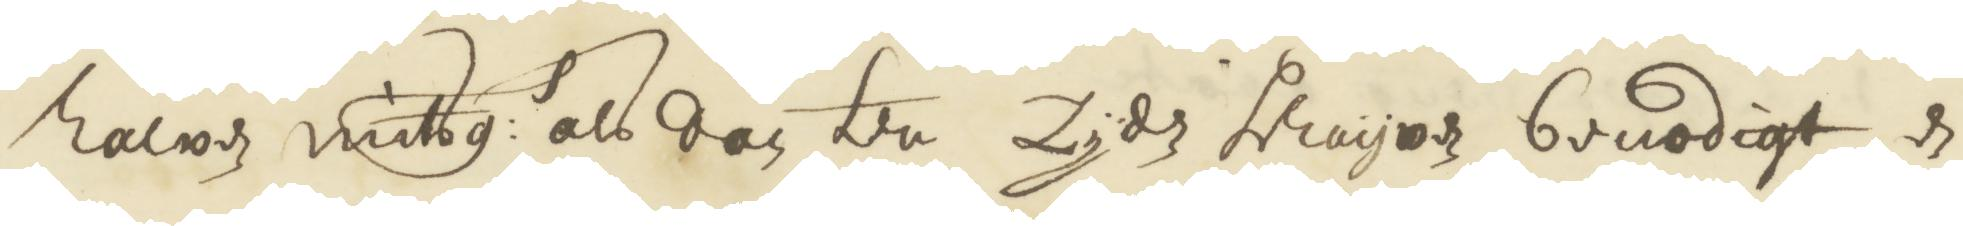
halven mitsg:s als dan ten zijden schrijven benodigt en
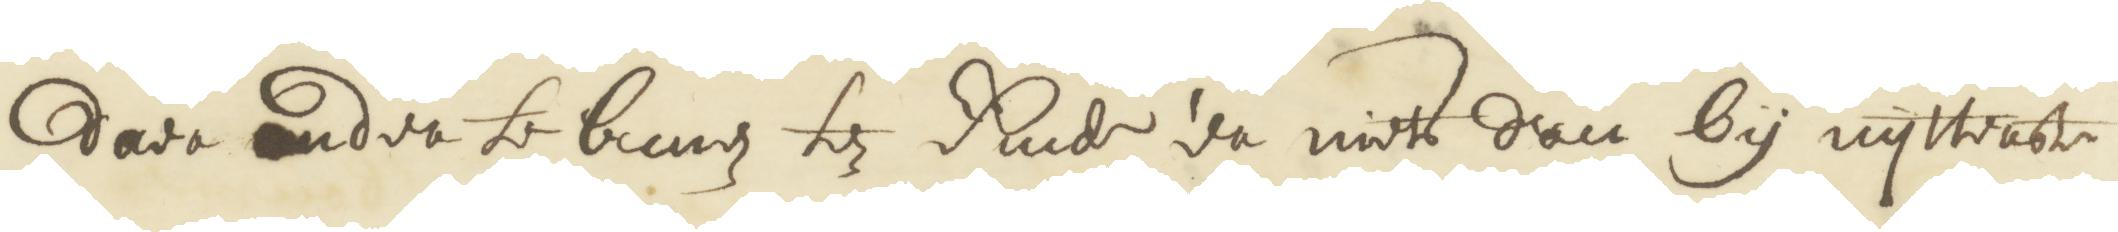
daer onder tekenen ten Einde 'er niets dan bij uijtterste
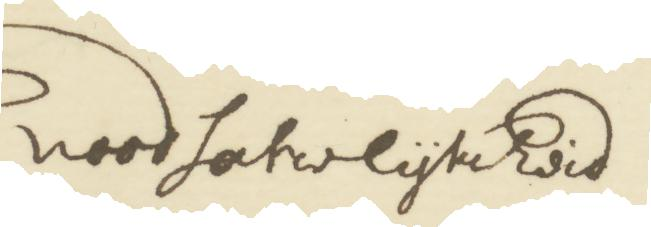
noodsakelijkheid
